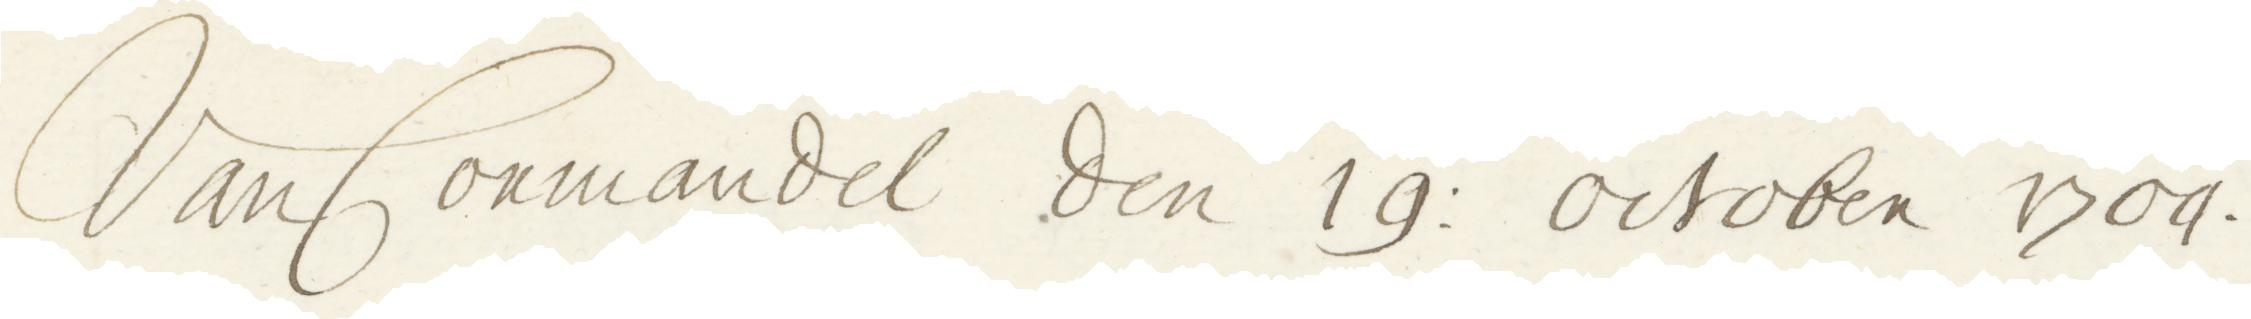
Van Cormandel den 19: october 1704.
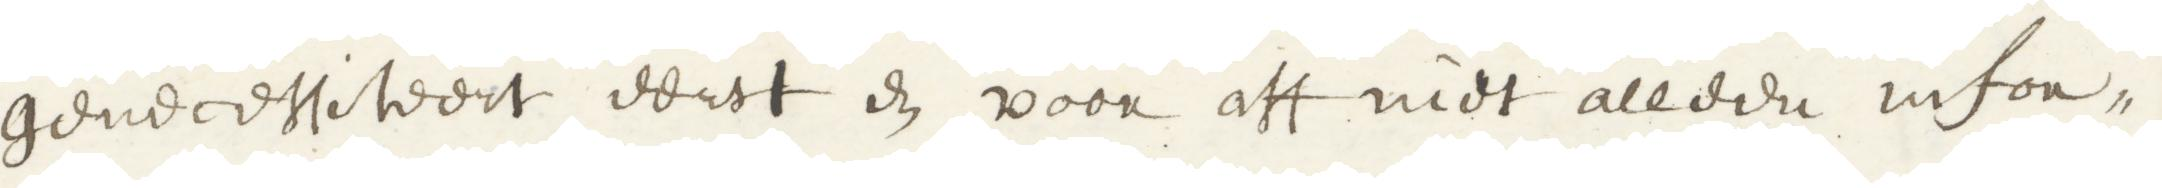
genecessiteert eerst en voor aff niet alleen infor„
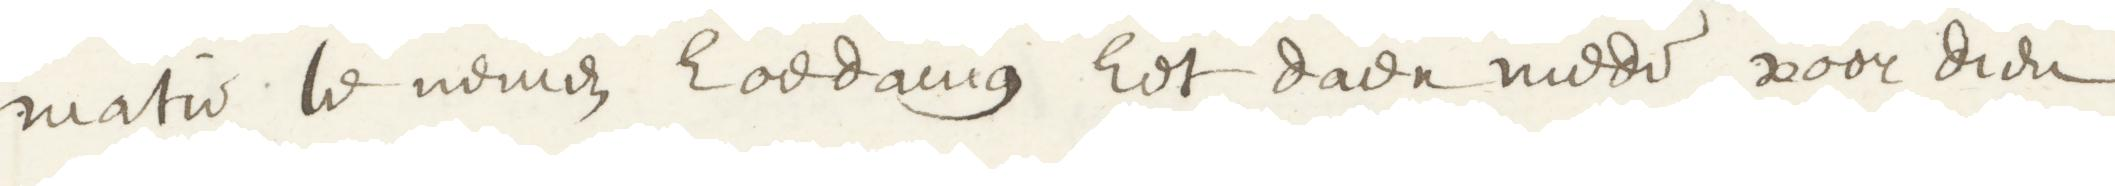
matie te nemen hoedanig het daer mede voor dien
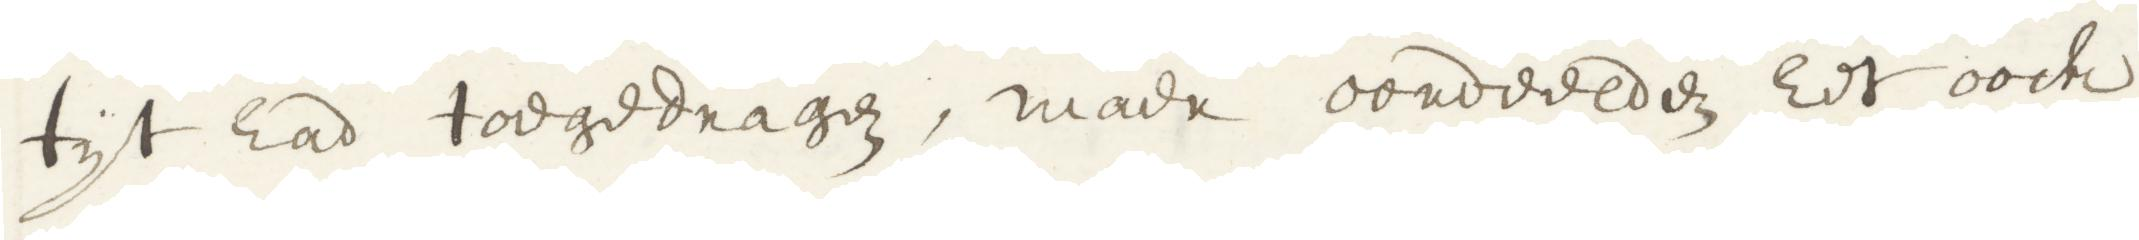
tijt had toegedragen, maer oordeelden het oock
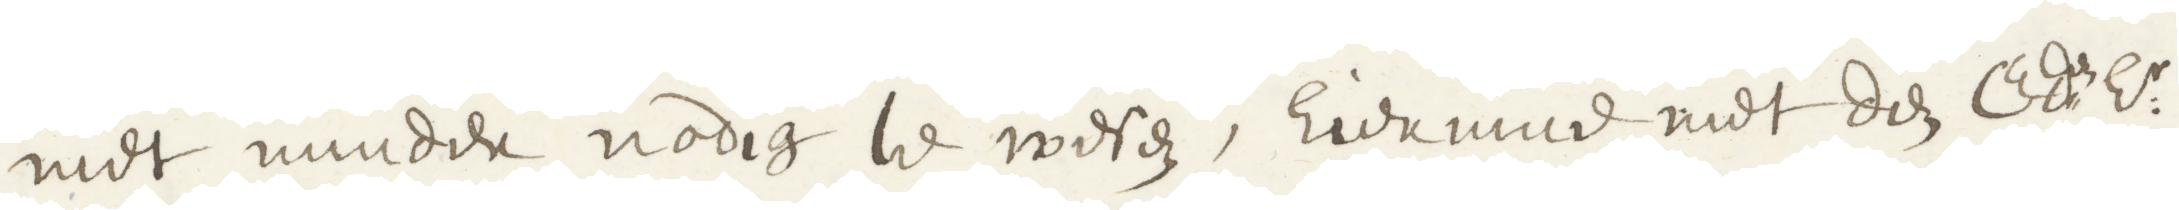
niet minder nodig te wesen, hierinne met den Ed:en h:r
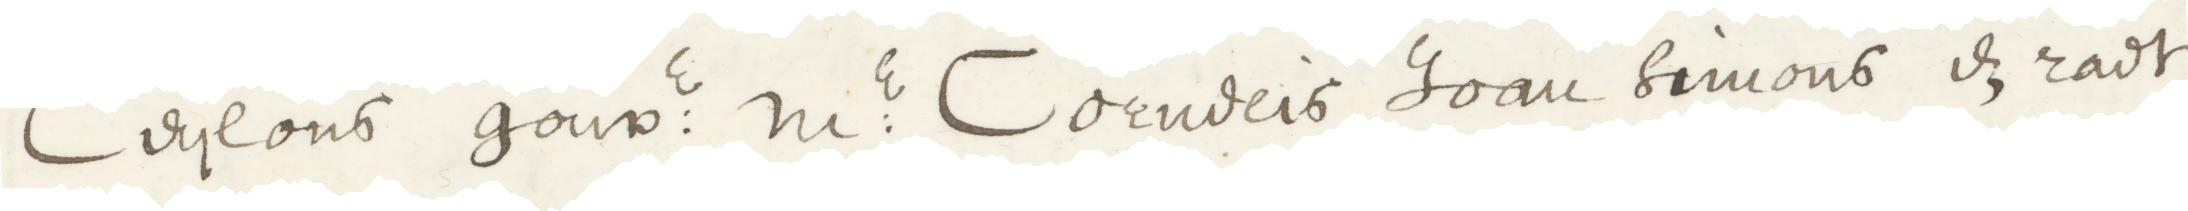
Ceijlons gouv:r m:r Cornelis Ioan Simons en raet
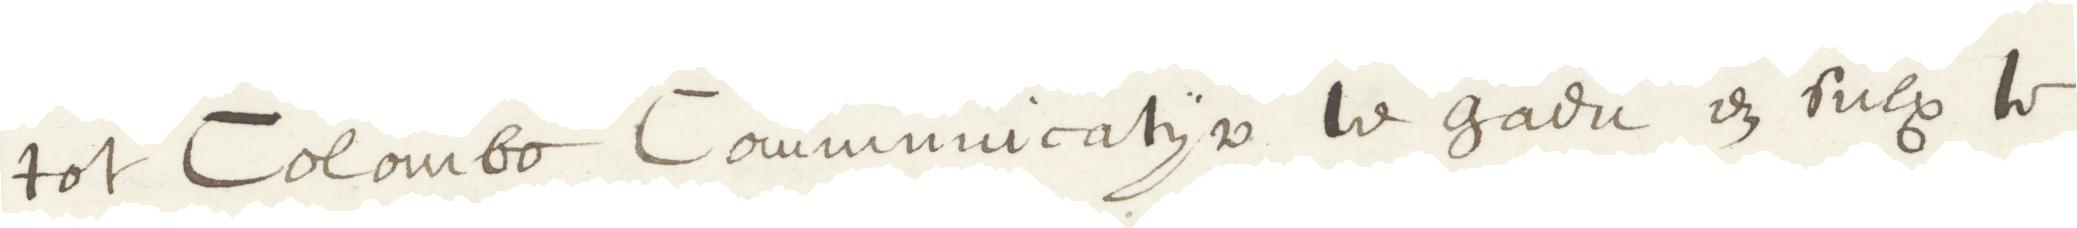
tot Colombo Communicatijv te gaen en sulx te
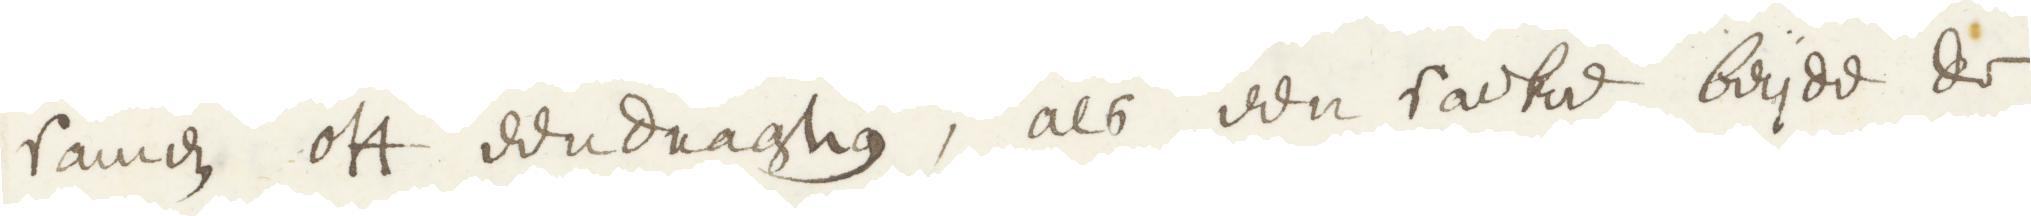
samen off eendragtig, als een saeke beijde de
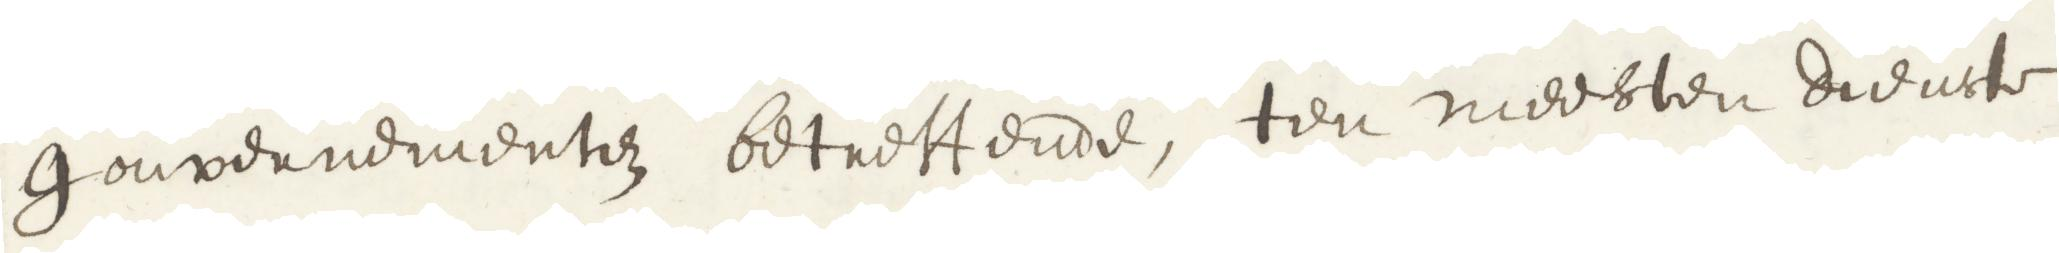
gouvernementen betreffende, ten meesten dienste
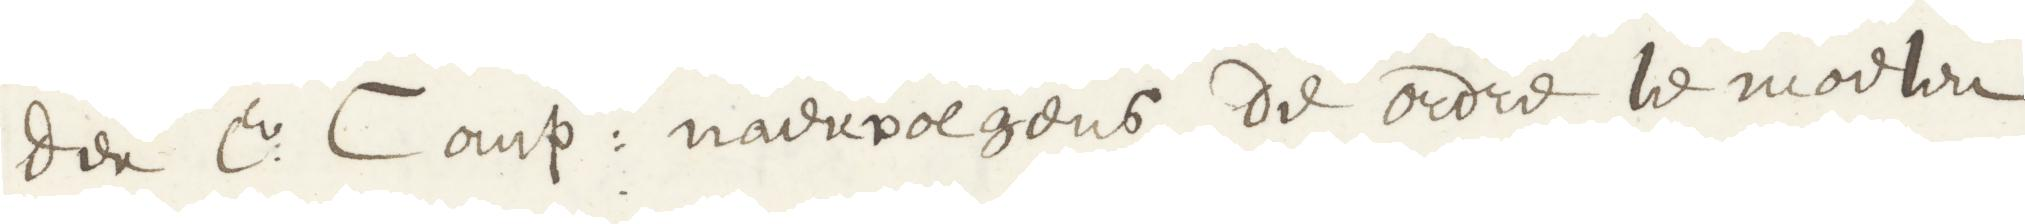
der E: Comp:s naervolgens de ordre te moeten
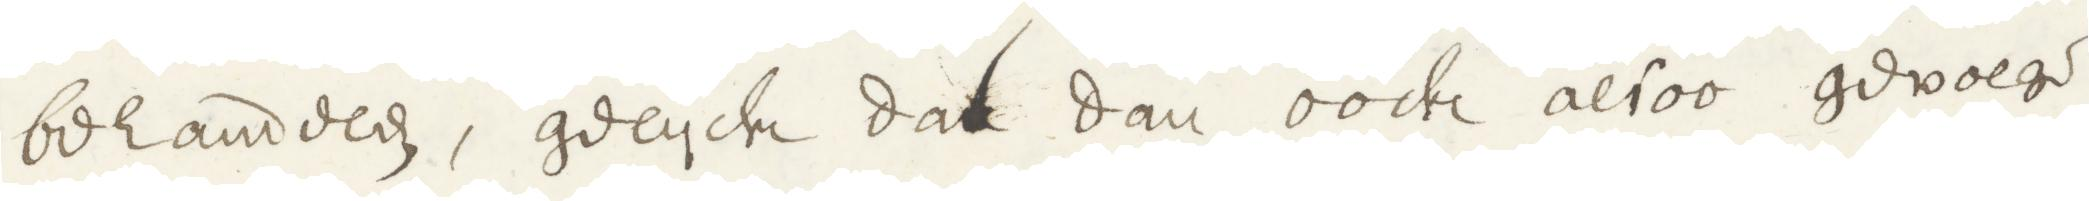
behandelen, gelijck dat dan oock alsoo gevolge
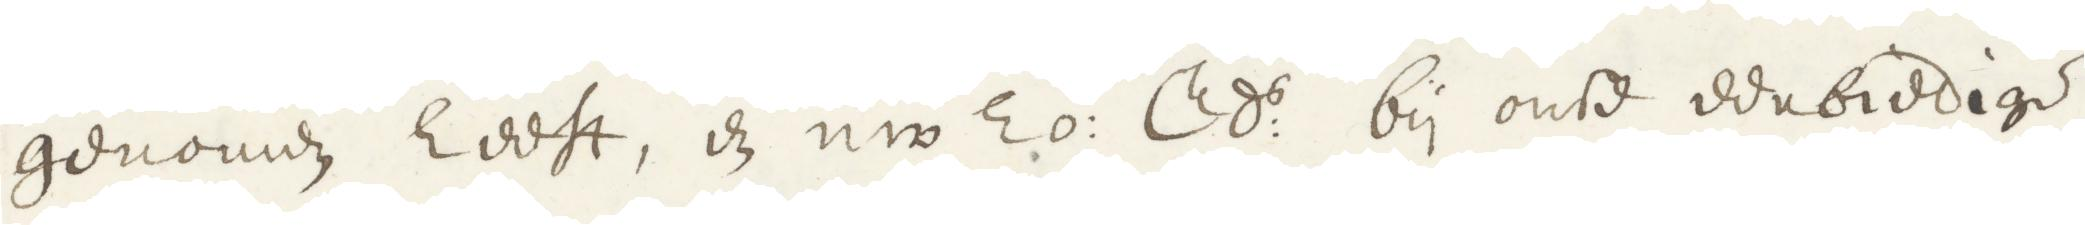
genomen heeft, en uw ho: Ed:s bij onse eerbiedige
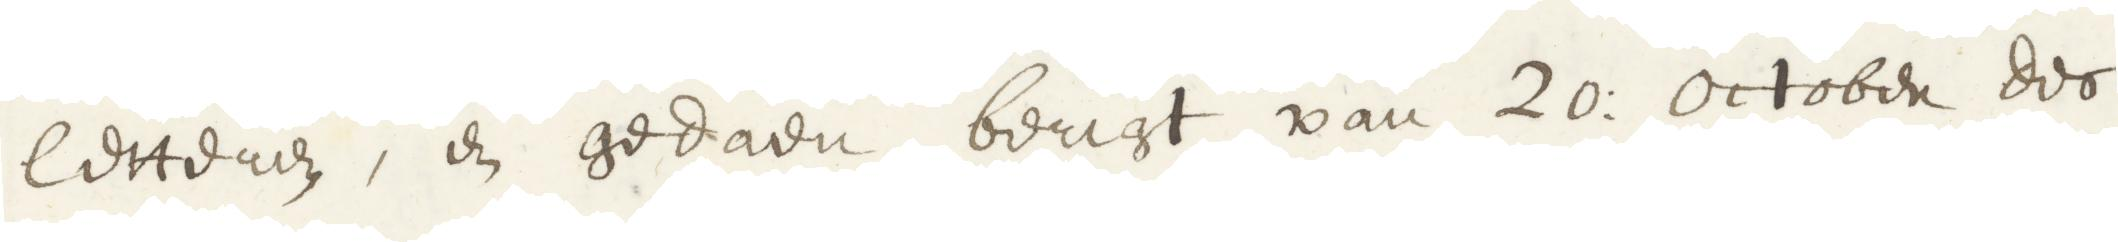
letteren, en gedaen berigt van 20: October des
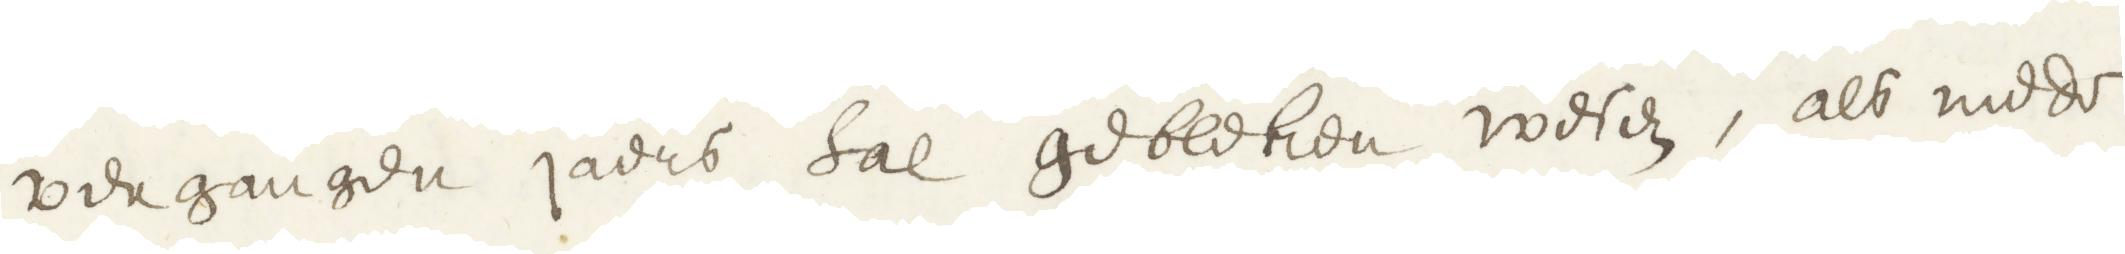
vergangen jaers sal gebleken wesen, als mede
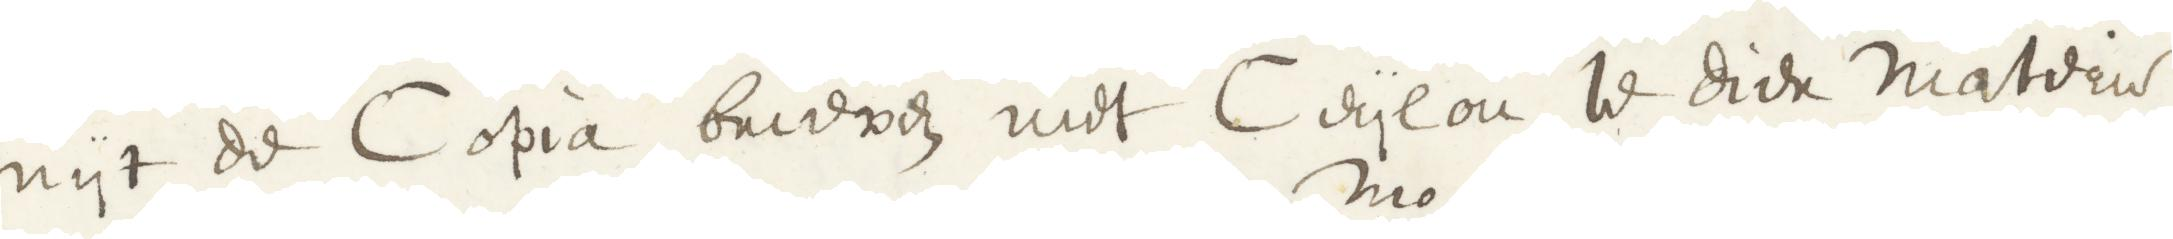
uijt de Copia brieven met Ceijlon te dier materie
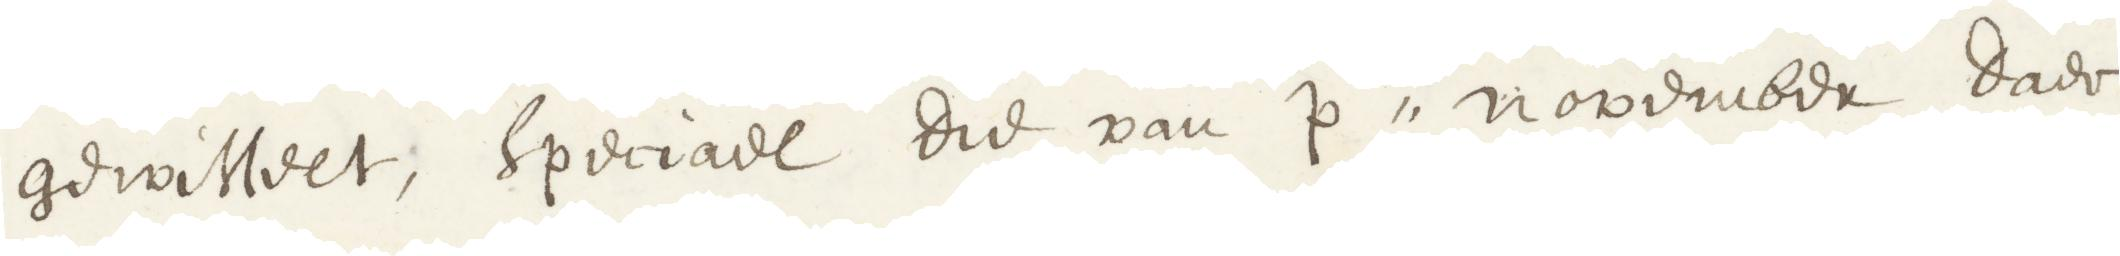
gewisselt, speciael die van p„mo november daer
